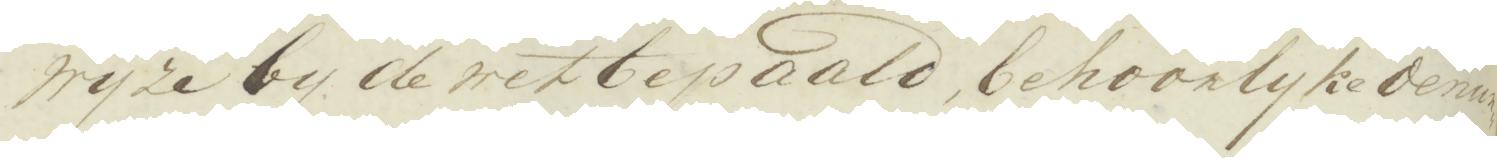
wyze by de wet bepaald, behoorlyke denun„
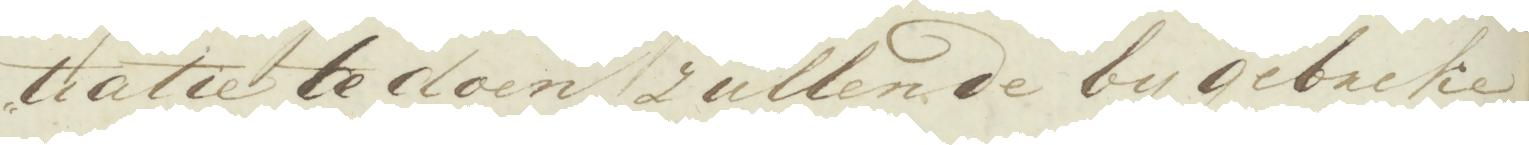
„tiatie te doen, zullende by gebreke
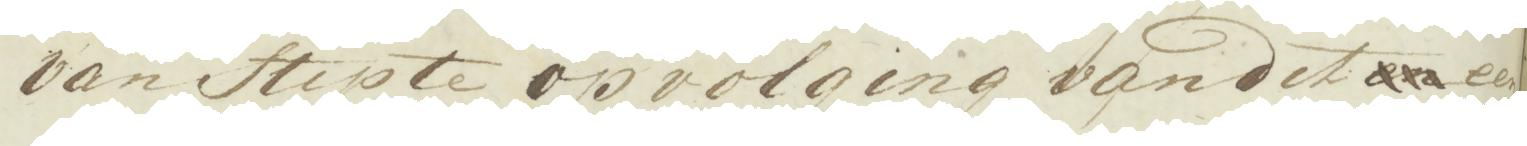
van stipte op volging van dit een
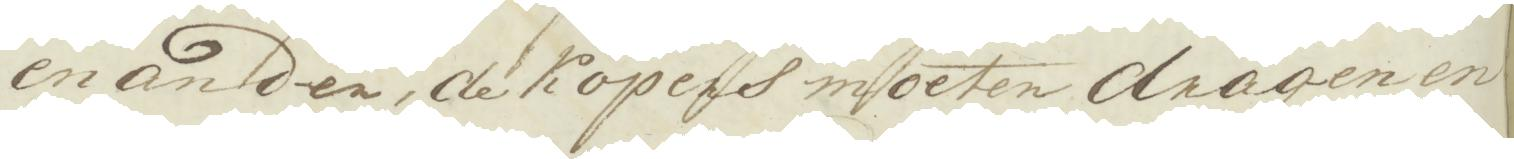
en ander, de kopers moeten dragen en
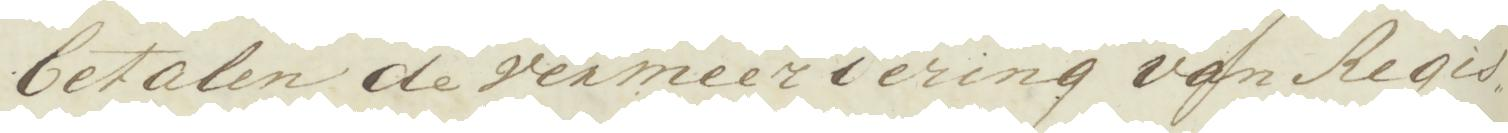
betalen de vermeerdering van Regis„
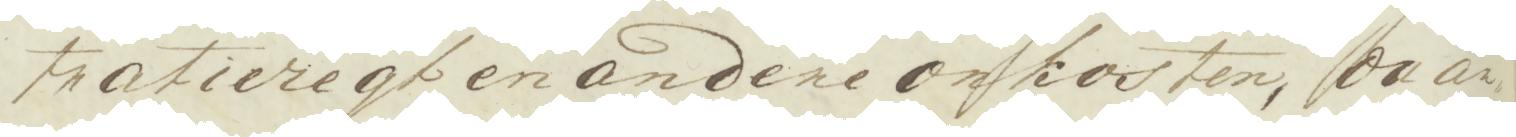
tratieregt en andere onkosten, daar„
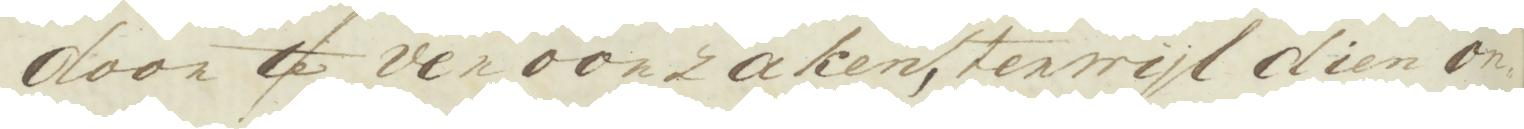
door te veroorzaken, terwijl dien on„
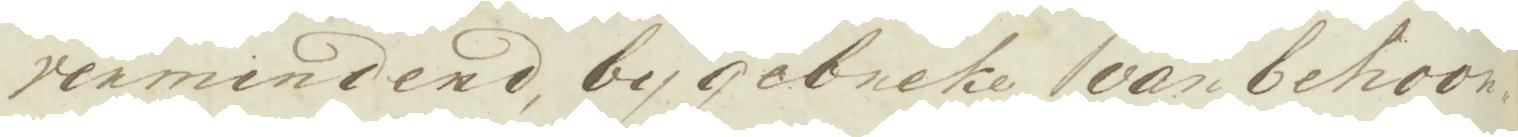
verminderd, by gebreke van behoor„
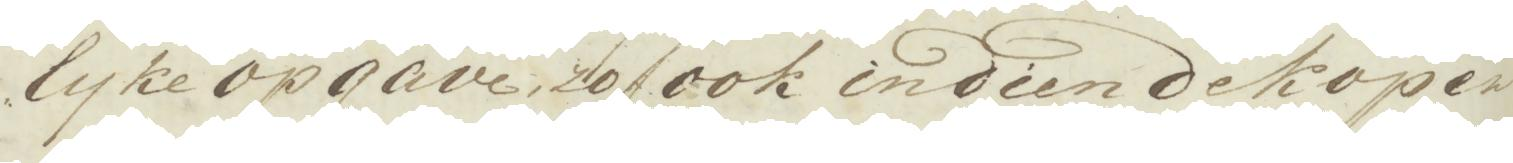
„lijke opgave, zo ook indien de koper
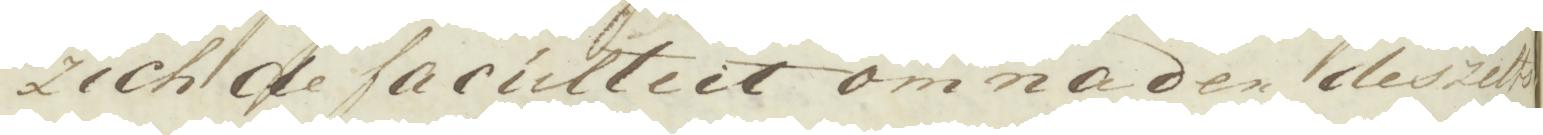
zich de faculteit om na der deszelfs
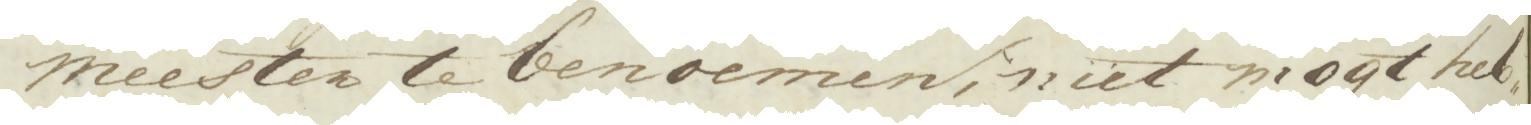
meester te benoemen, niet mogt het„
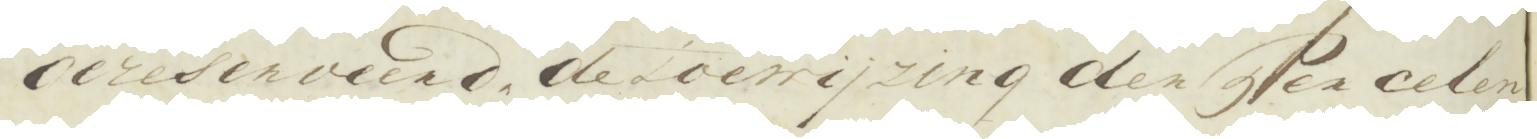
gereserveerd, de toewijzing der Percelen
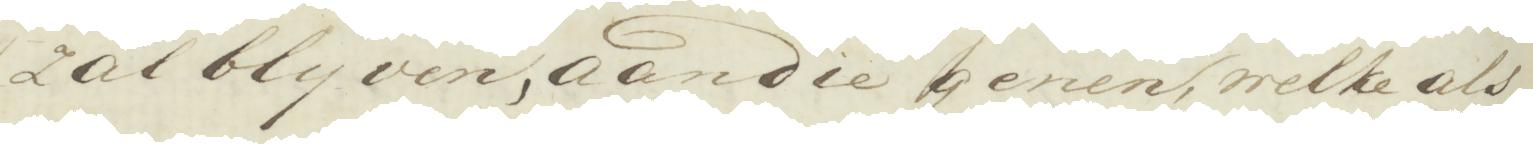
zal blyven, aan die genen, welke als
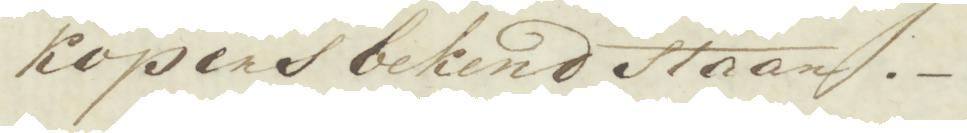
kopers bekend staan.-
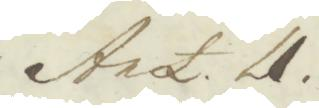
Art. 4.
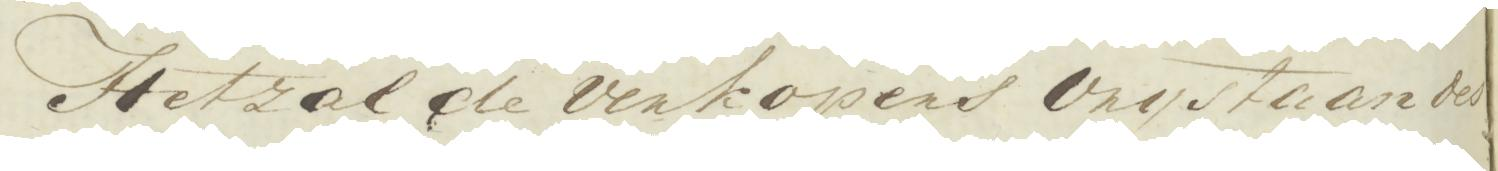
Hetzel de verkopers vrystaan des
